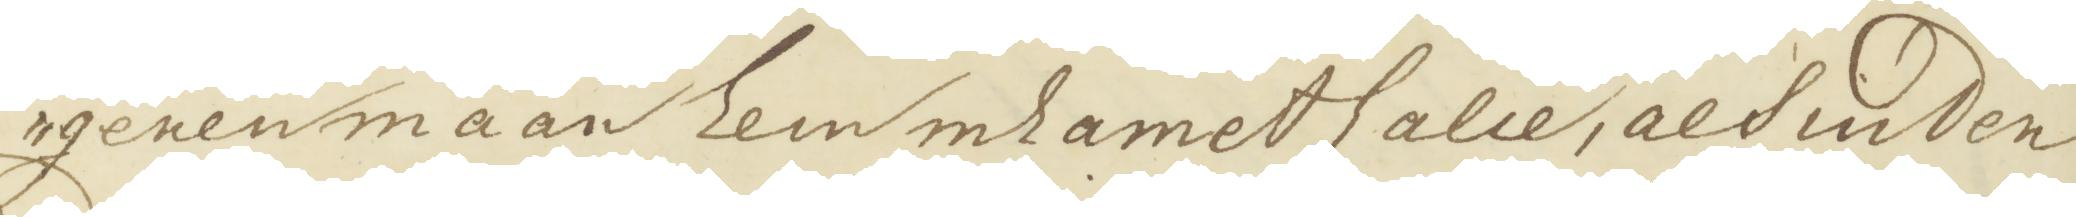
„geren maar hem mhameth alie, als in der
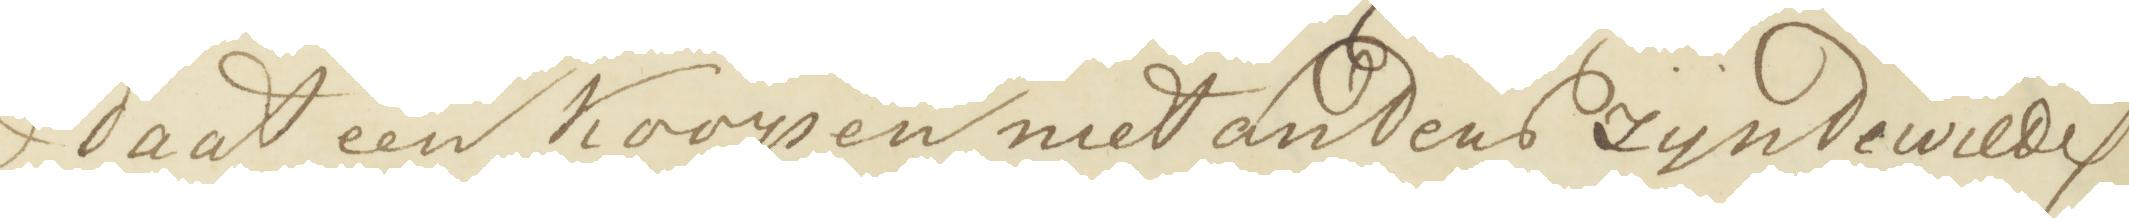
„daat een koop en niet anders zijnde wilde
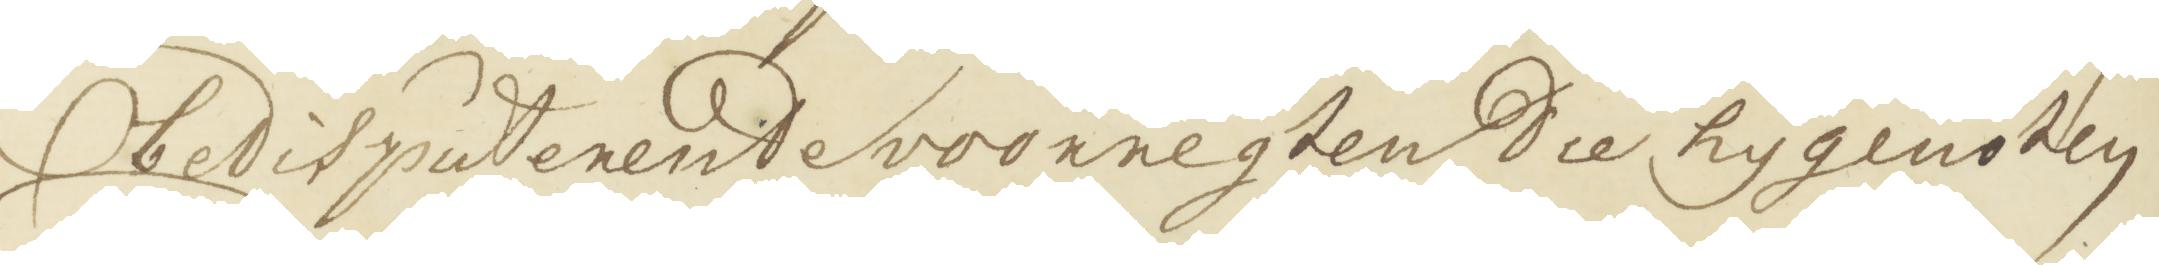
bedisputeren de voorregten die hij genoten
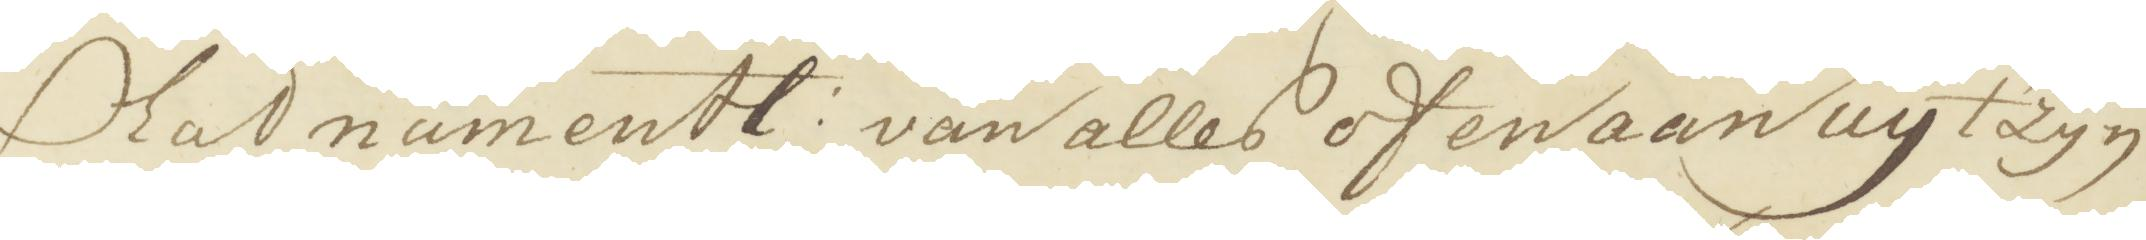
had namentl: van alles of en aan uijt zijn
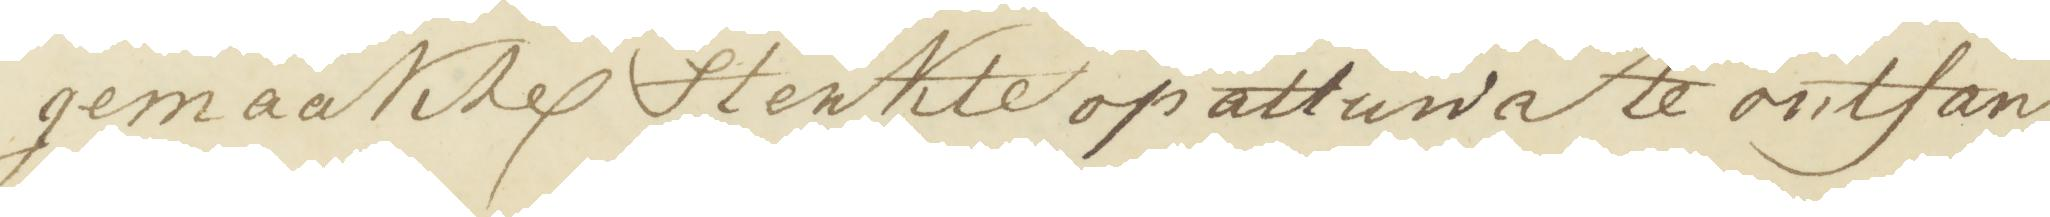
gemaakte sterkte op attuwa te ontfan
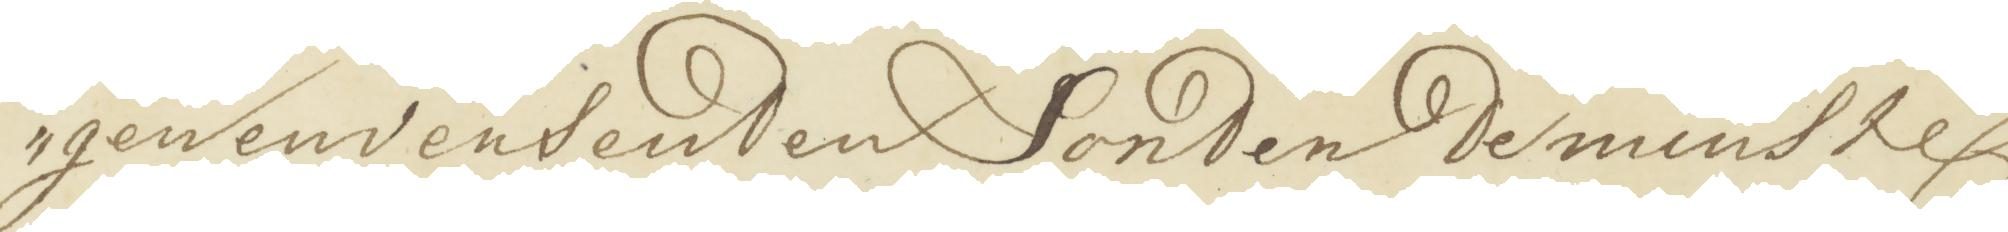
„gen en versenden Sonder de minste
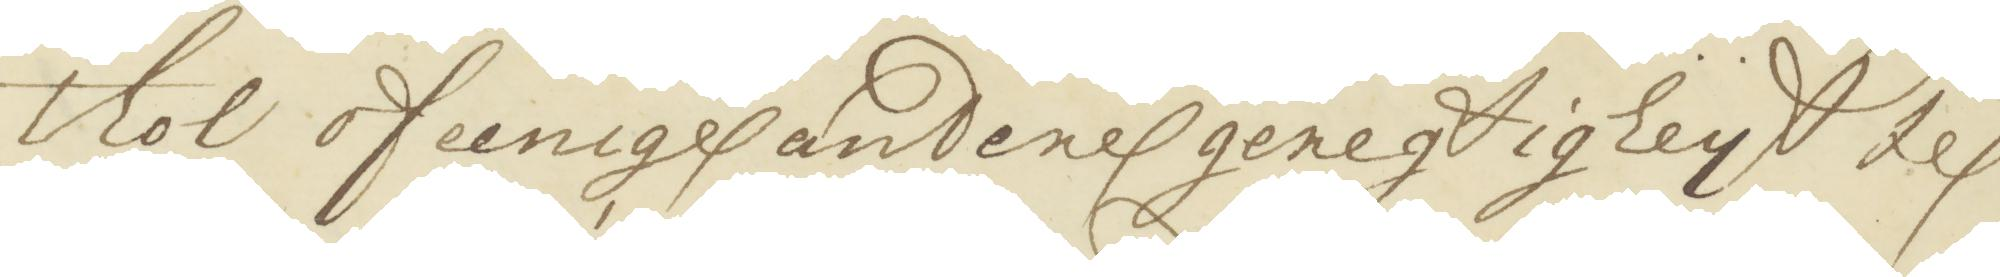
thol of eenige andere geregtigheijt te
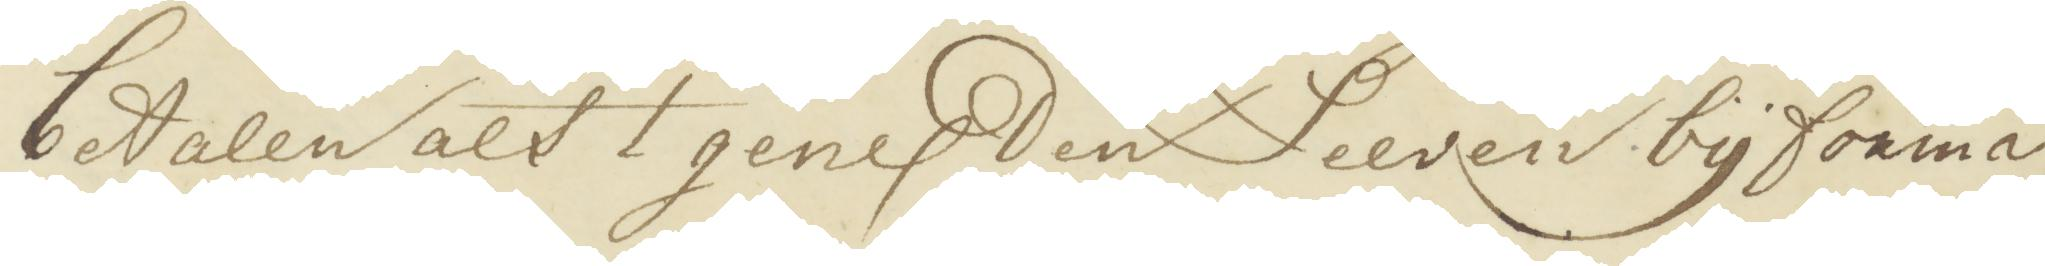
betalen als 't gene den Leeven bij forma
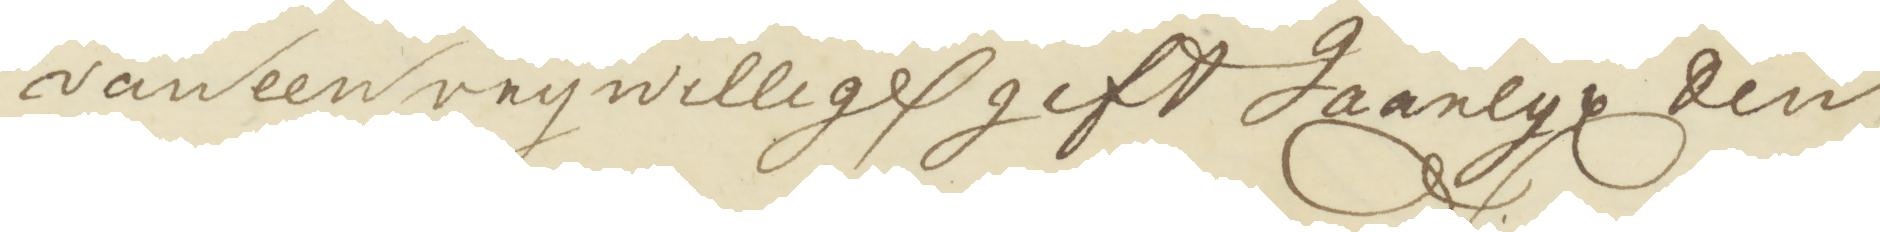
van een vrijwillige gift Jaarlijx den
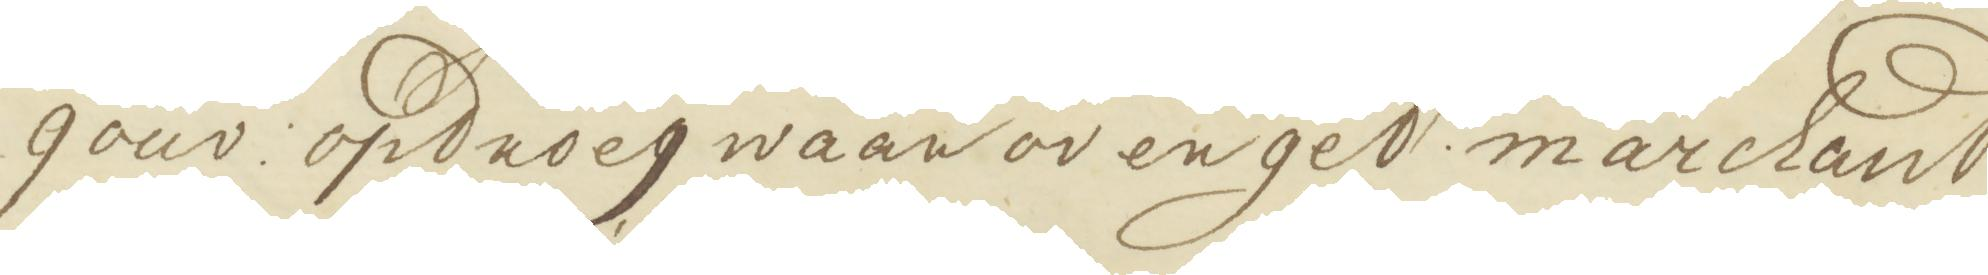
gouv: opdroeg waar over ged: marchand
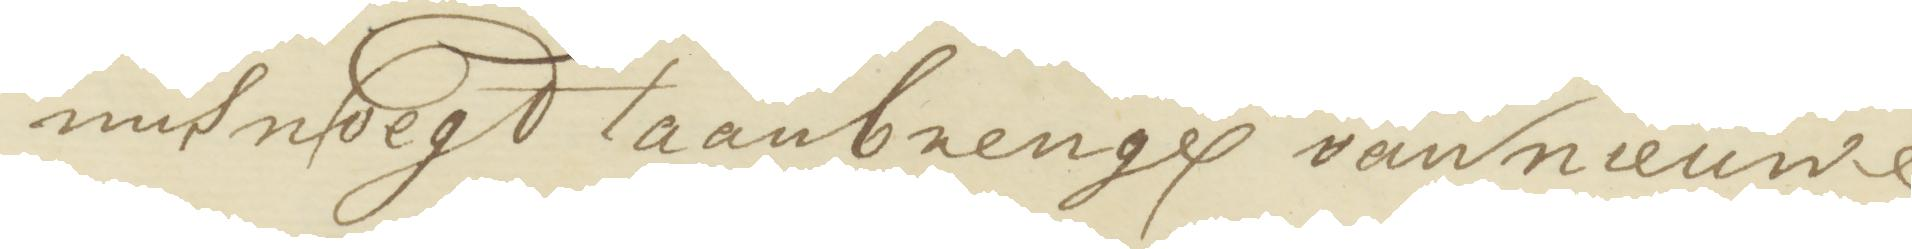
misnoegd 't aanbrenge van nieuwe
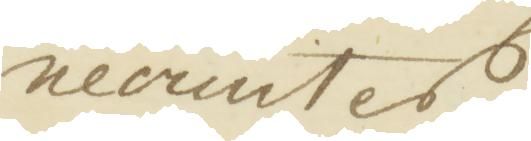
recruites
